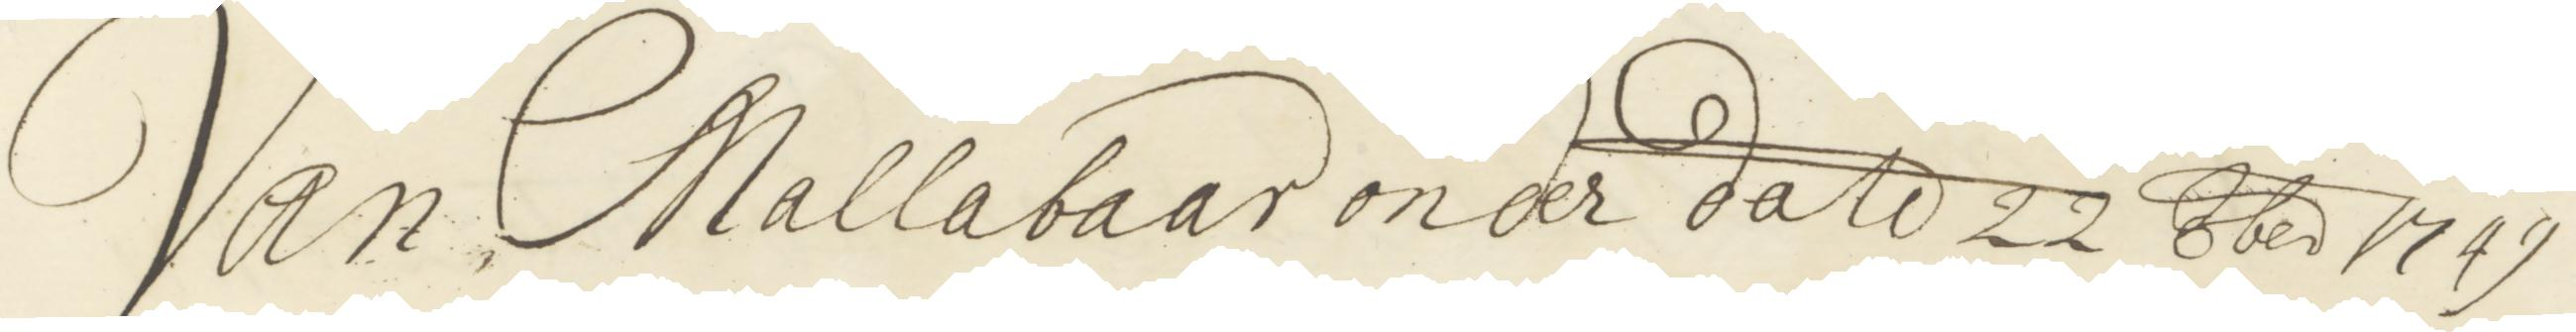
Van Mallabaar onder dato 22 8ber 1749
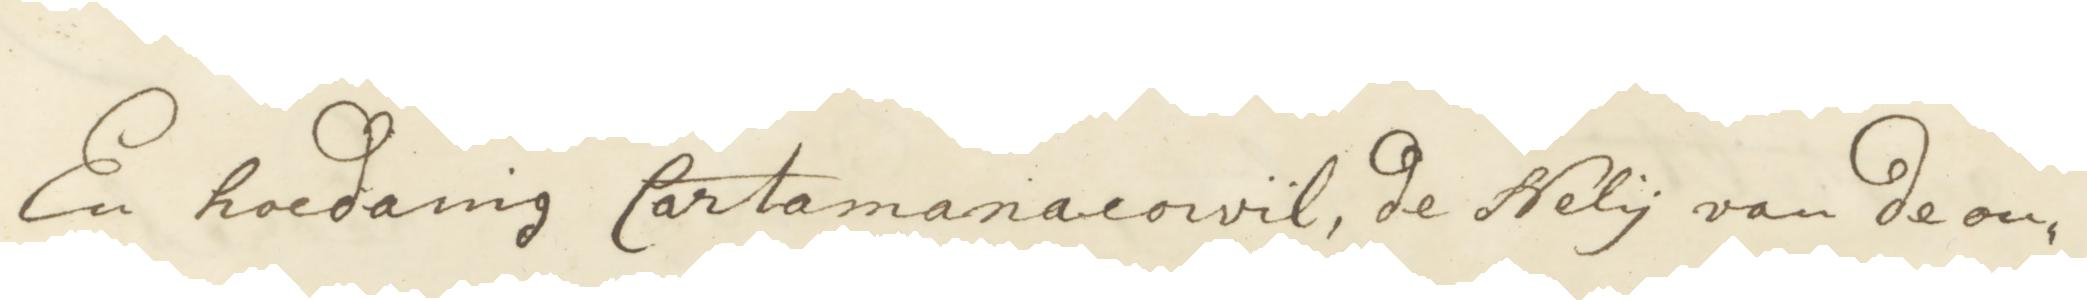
En hoedanig Cartamanacowil, de Nelij van de on„
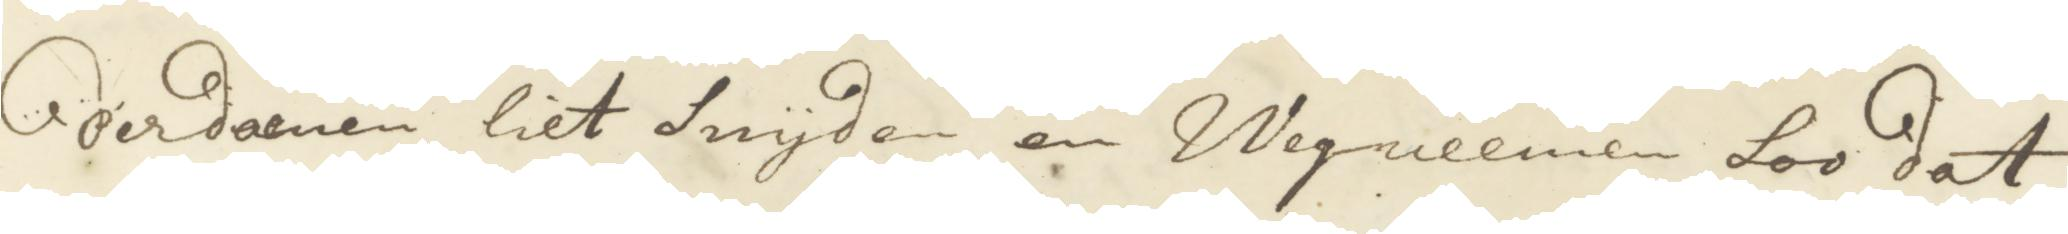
derdaenen liet snijden en Wegneemen soo dat
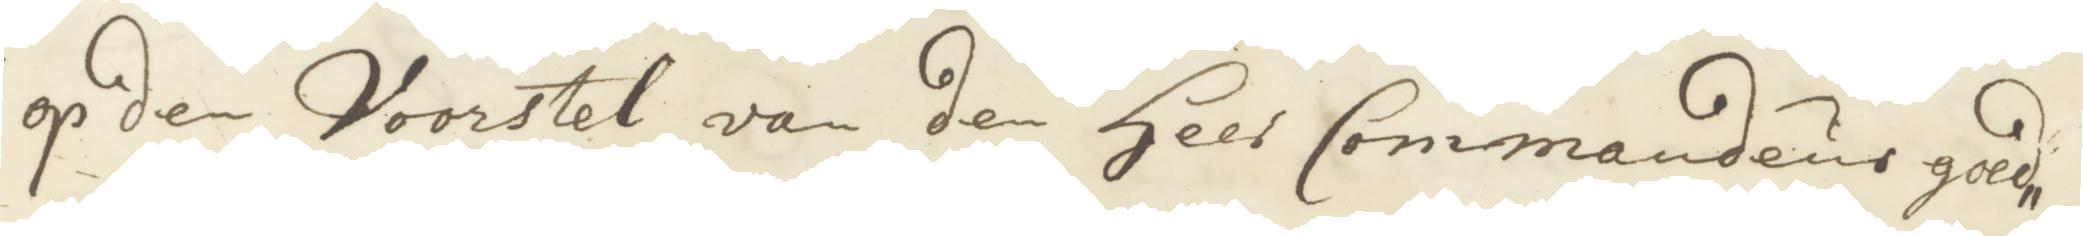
op den Voorstel van den Heer Commandeur goed„
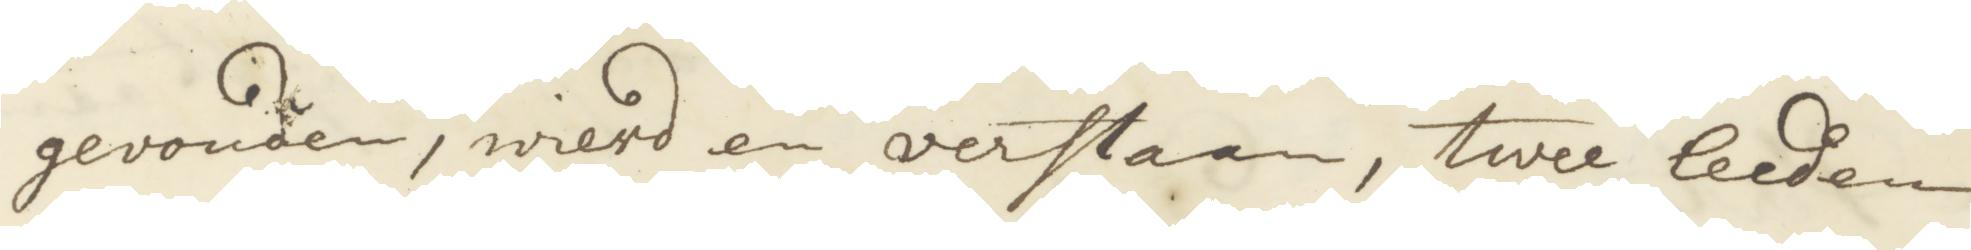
gevonden, wierd en verstaan, twee leeden
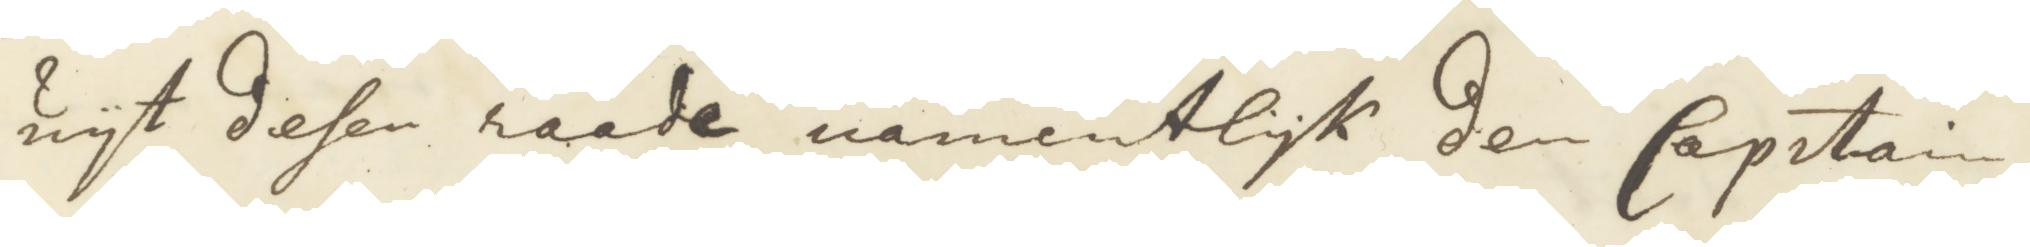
uijt desen raade namentlijk den Capitain
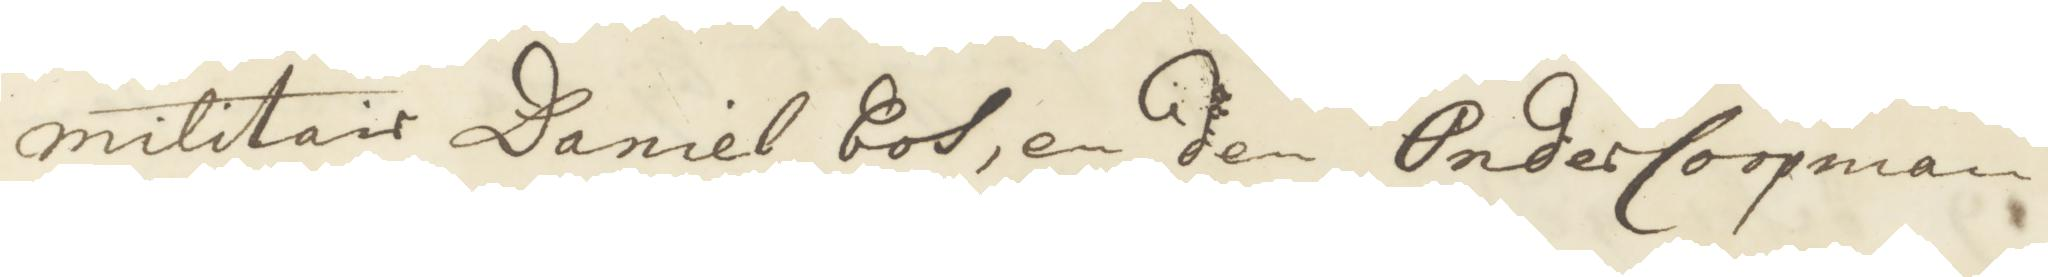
militair Daniel bos, en den Ondercoopman
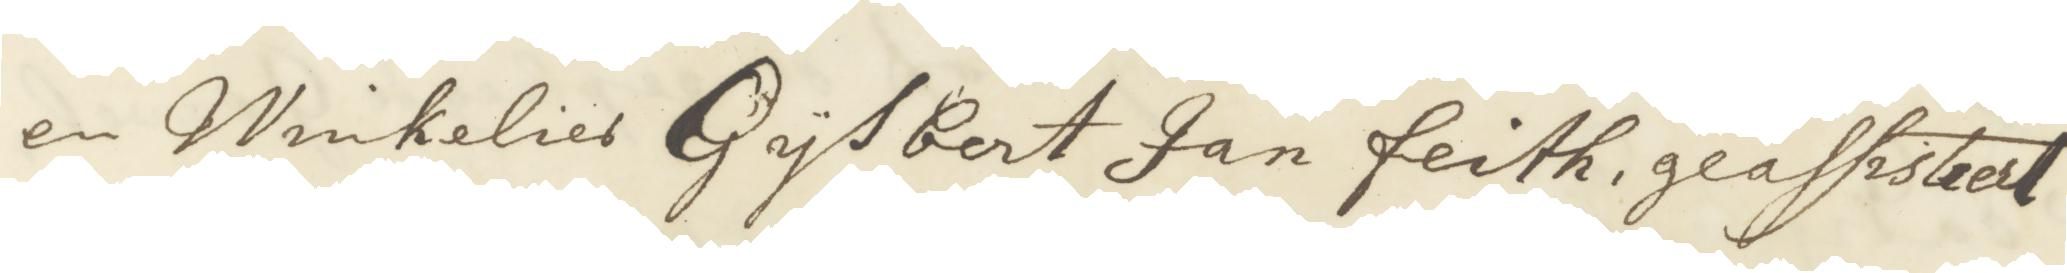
en Winkelier Gijsbert Jan feith, geassisteert
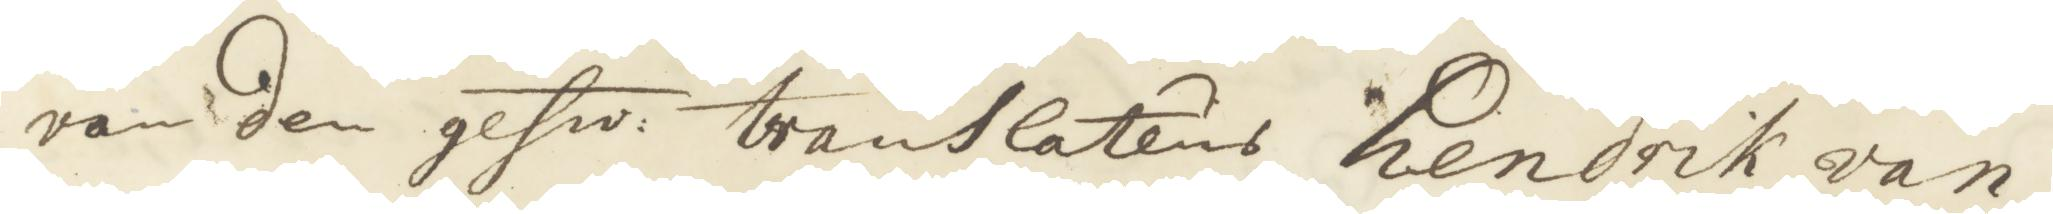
van den gesw: translateur Hendrik van
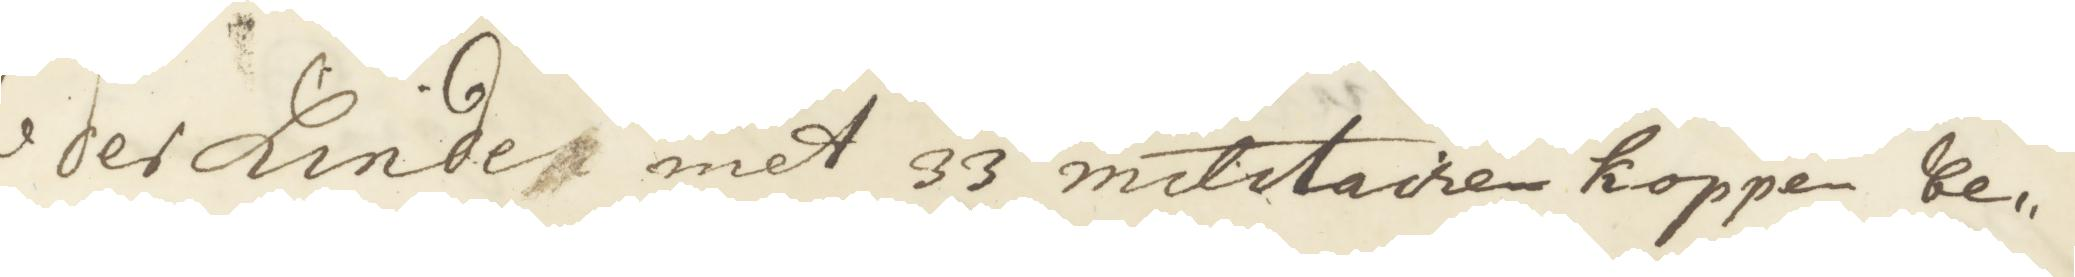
der linde met 33 militairen koppen be„
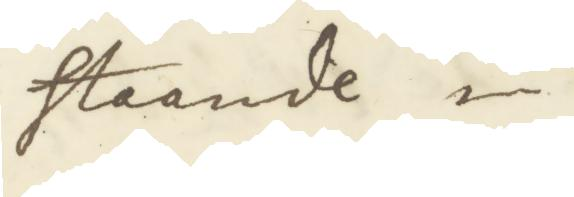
staande in
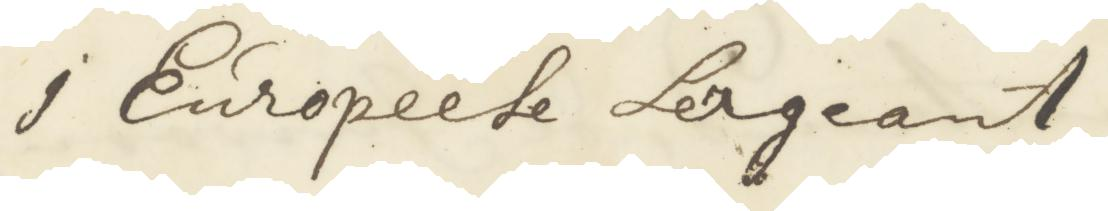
1 Europeese sergeant
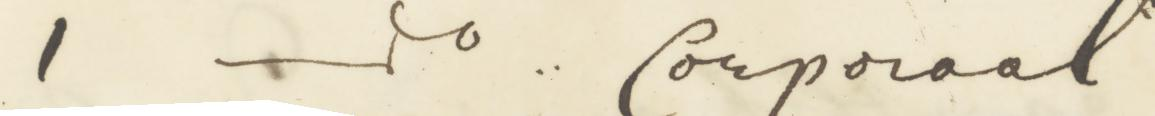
1 _o Corporaal
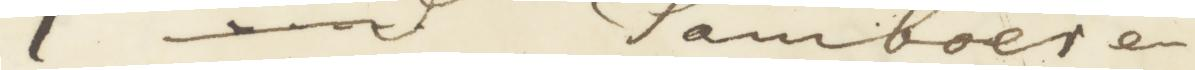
1 _o Tamboer en
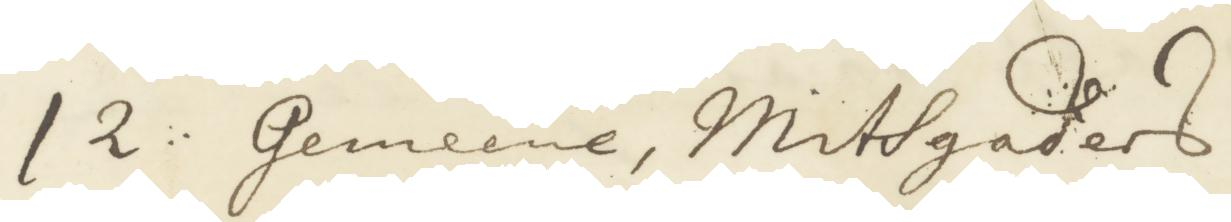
12: Gemeene, mitsgaders
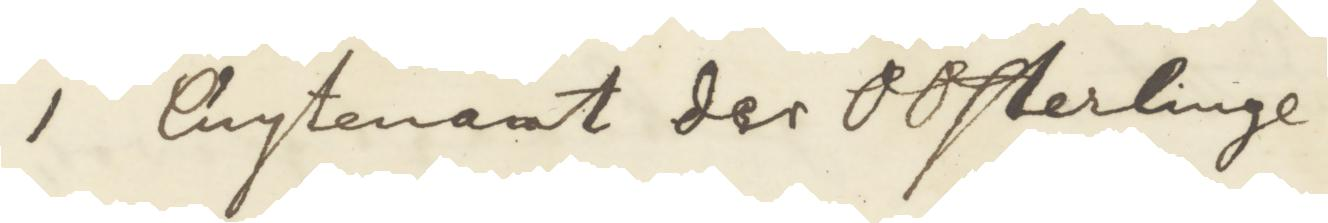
1 luytenant der Oosterlinge
